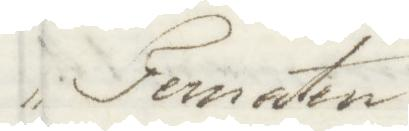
„ Ternaten
